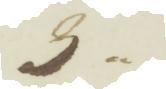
3 „ —
